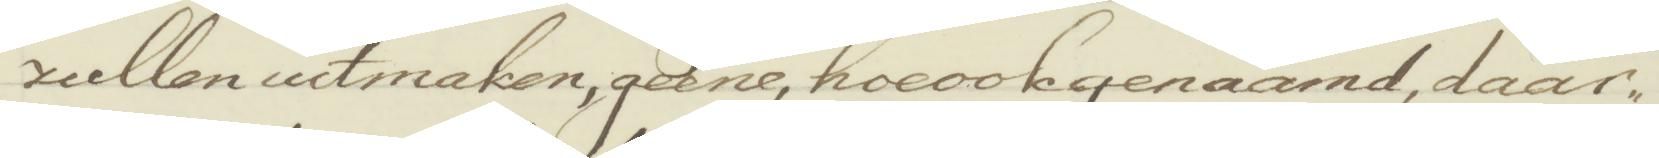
zullen uitmaken, geene, hoe ookgenaamd, daar„
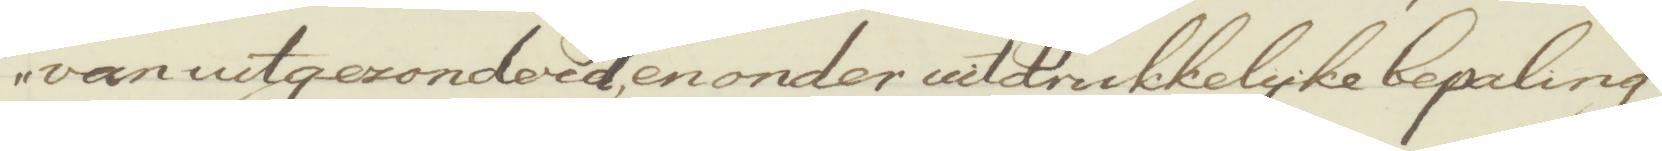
„van uitgezonderd, en onder uitdrukkelijke bepaling
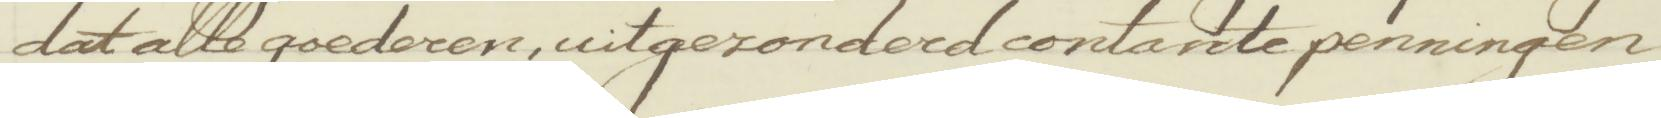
dat alle goederen, uitgezonderd contante penningen
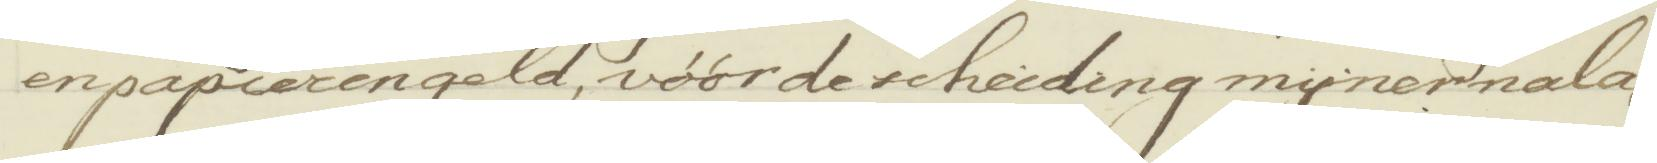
en papierengeld, vóór de scheiding mijner nala„
